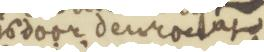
is door den roest
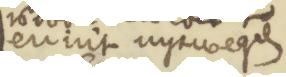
en in't uytwegen
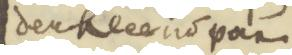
der kleene par
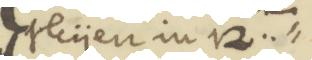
thijen in 12:„
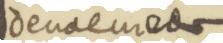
denalmede
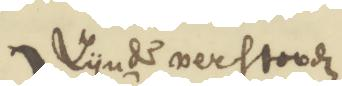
zijnde verstoven
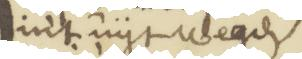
in 't uijtwegen
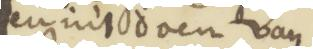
en in 't doen van
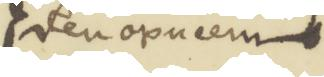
Een opneem
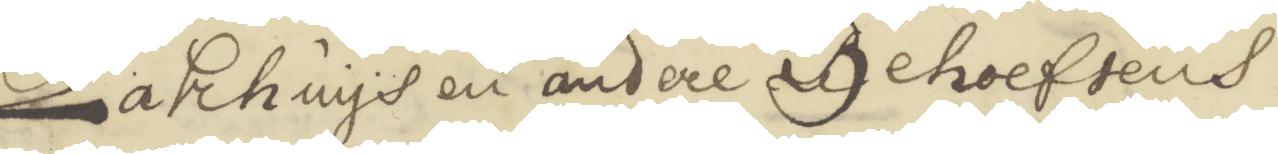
Pakhuijs en andere Behoeftens
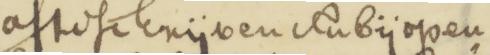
afteschrijven En bij open
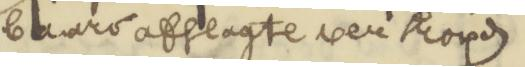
baare afslagte verkopen
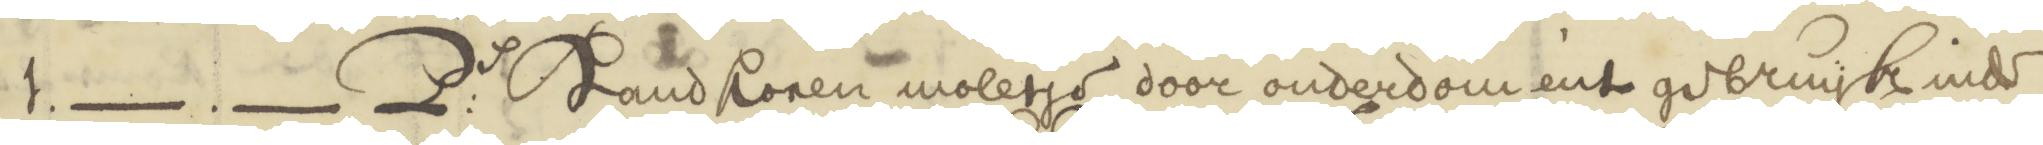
1.—.— P:s hand koren moletje door ouderdom in't gebruijk inde
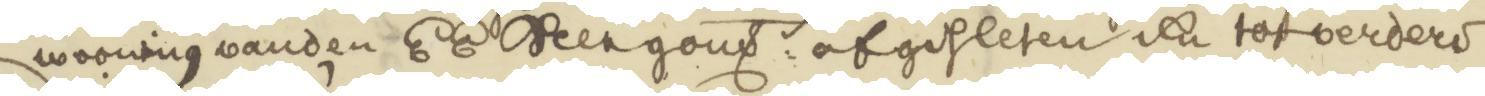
wooning vanden E E Heer gouver:s afgesleten En tot verdere
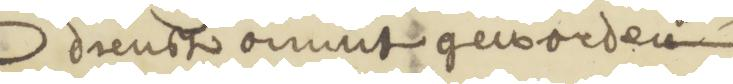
dienst onnut geworden
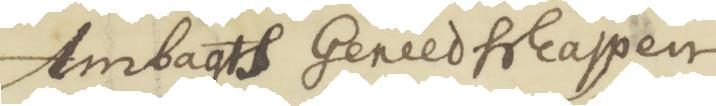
Ambagts Gereedschappen
